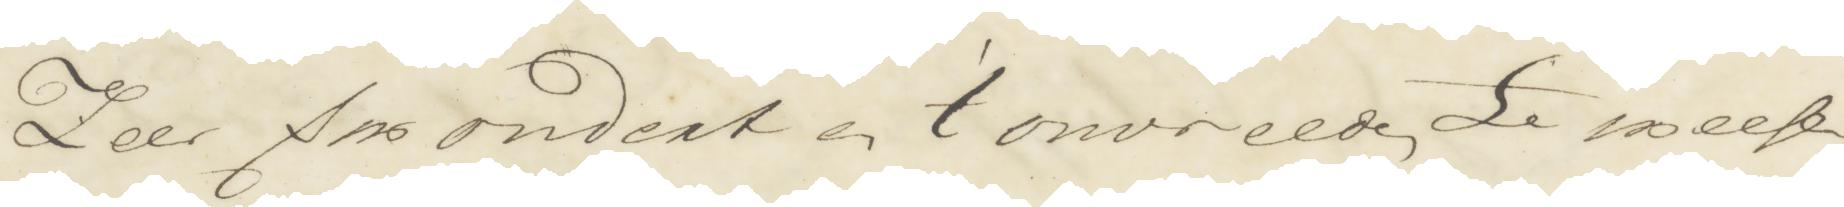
Zeer verwondert en 't onvreeden te weesen
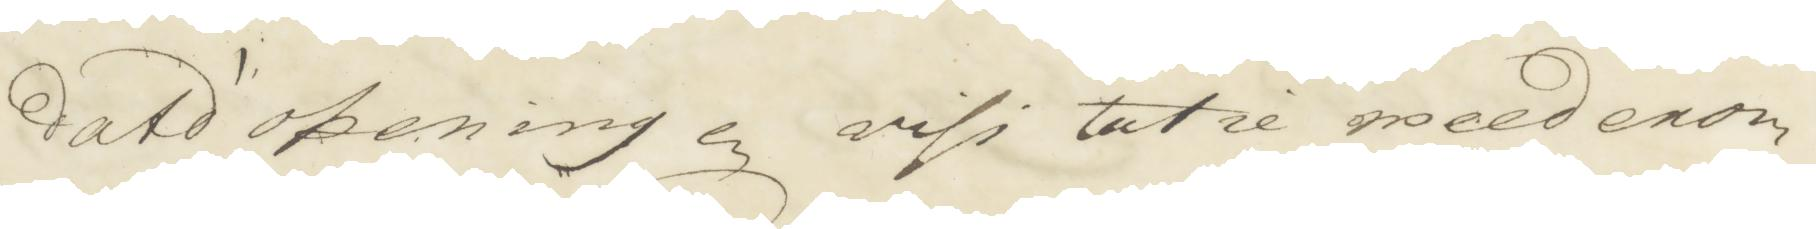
dat d' opening en visi tatie weederom
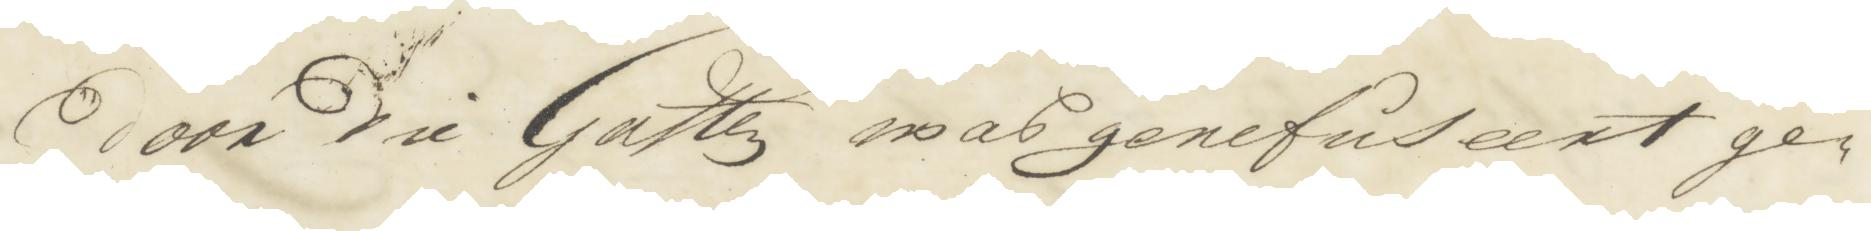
door die Gasten was gerefuseert ge„
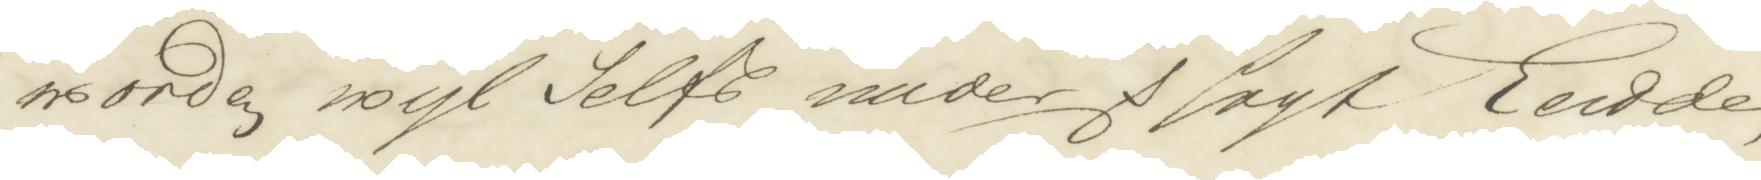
worden wijl selfs nader versogt hadden,
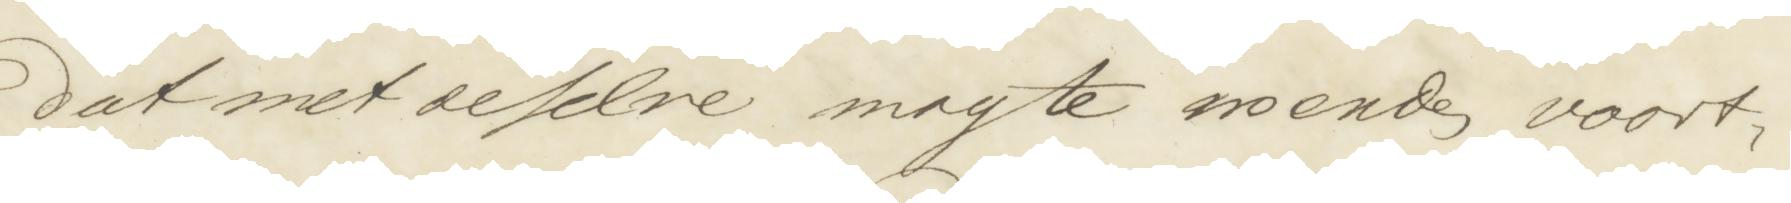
dat met deselve mogte werden voort,
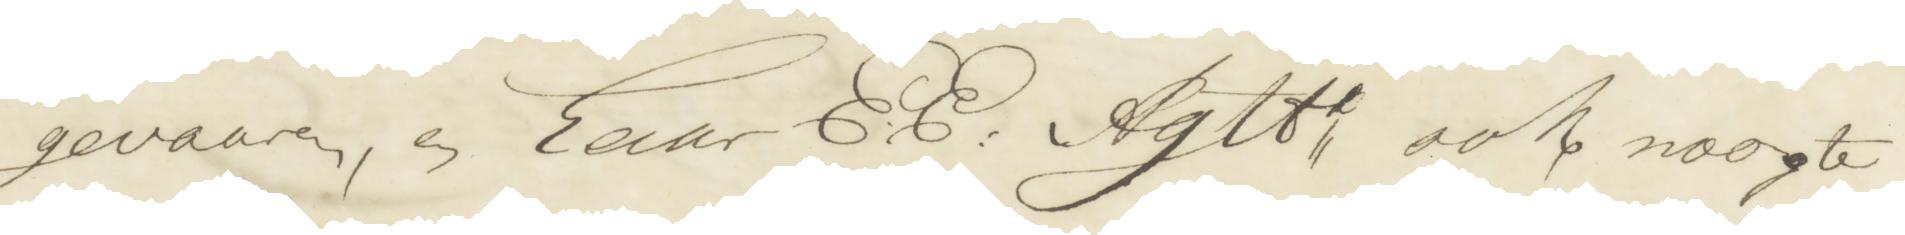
gevaaren, en haar E:E: Agtb„r ook noog te
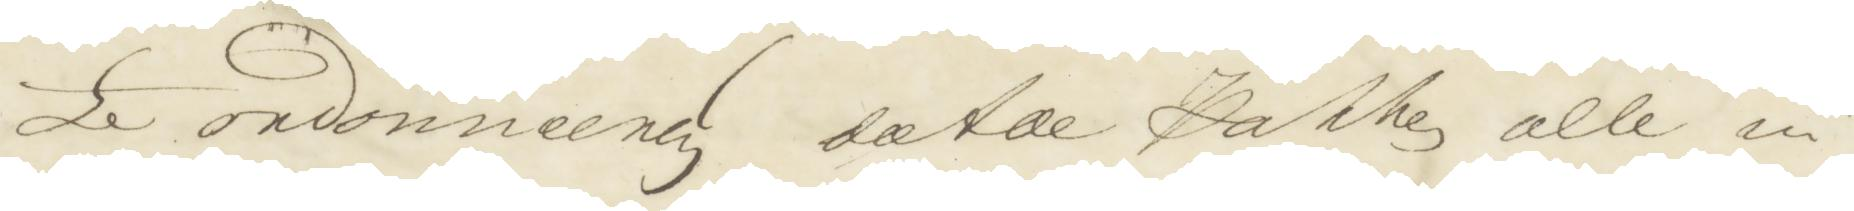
te ordonneeren deet de Pakken alle in
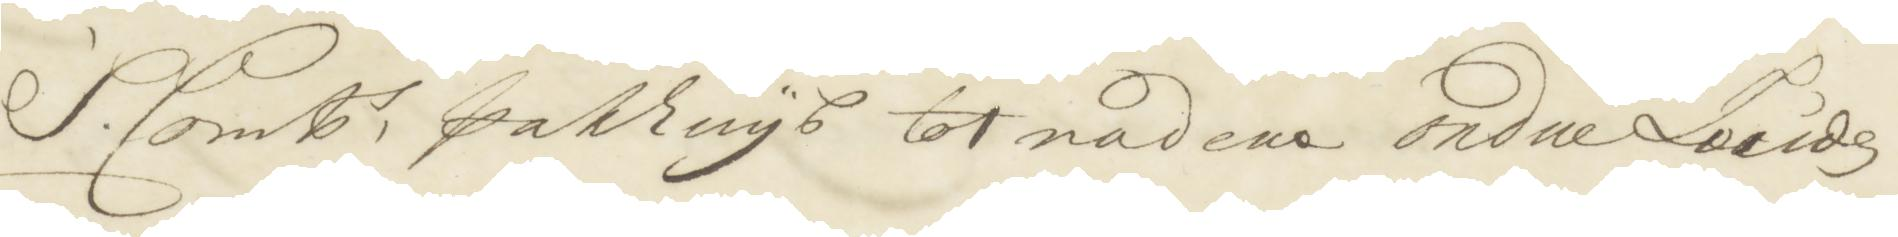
S: Comp„s pakhuijs tot nadere ordre Zouden
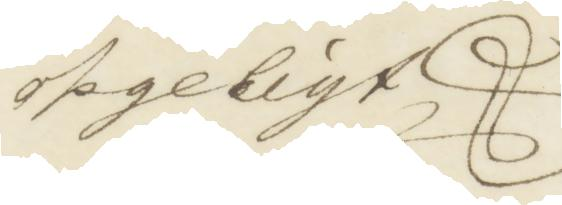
opgeligt,
